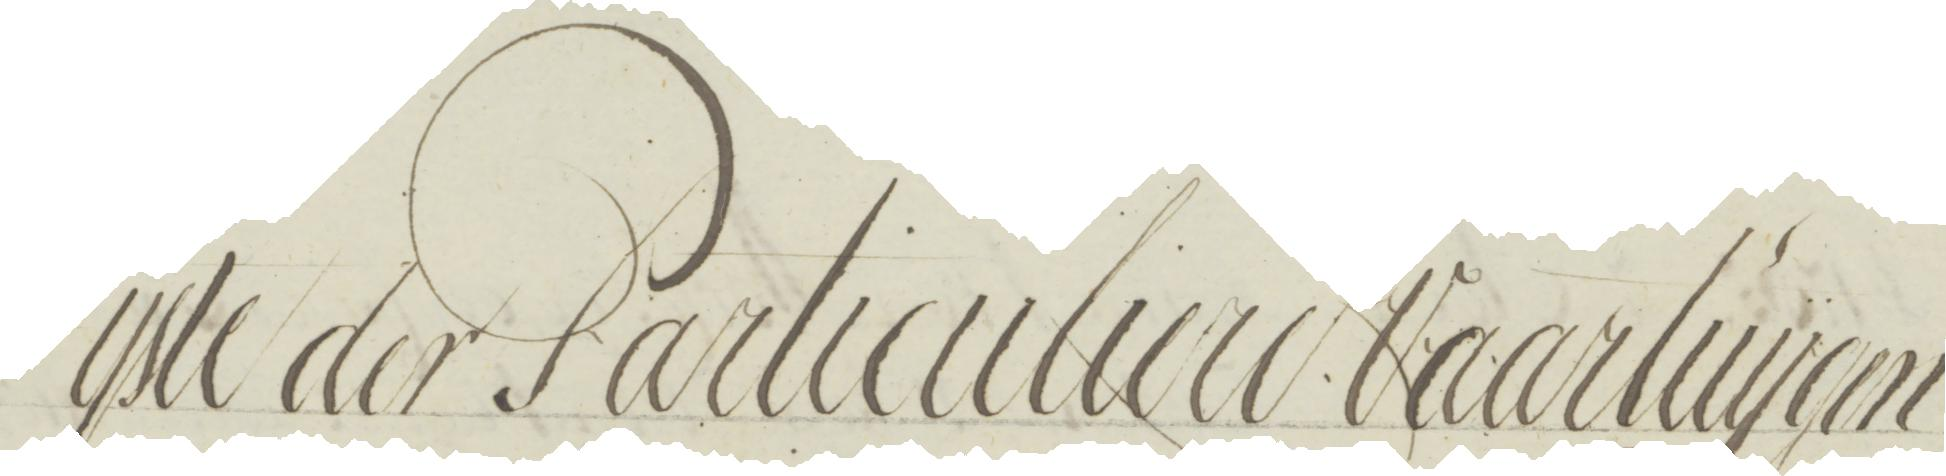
ijste der Parliculiere Vaartuijgen
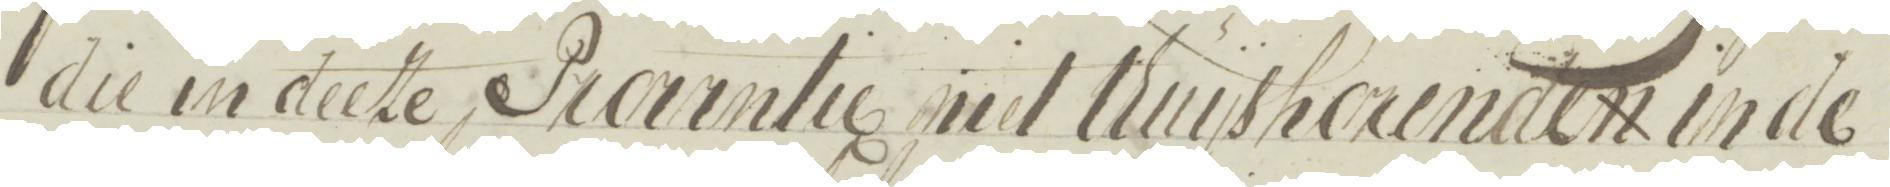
die in deeze Provintie niet thuijshorenden in de
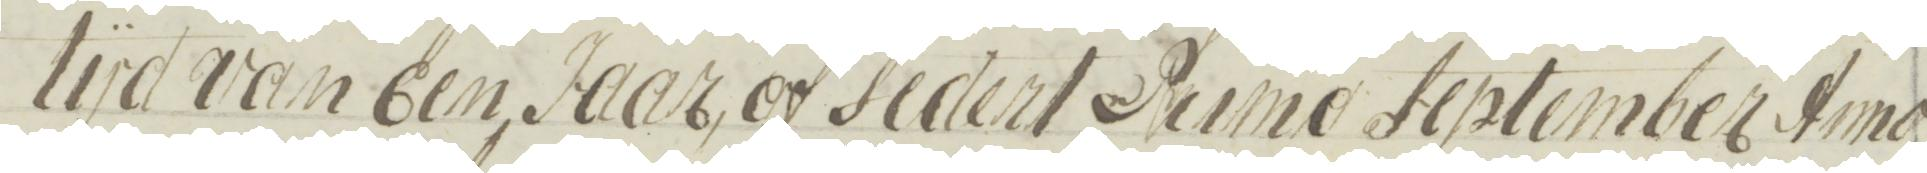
tijd van Een Iaar, of Sedert Primo September Anno
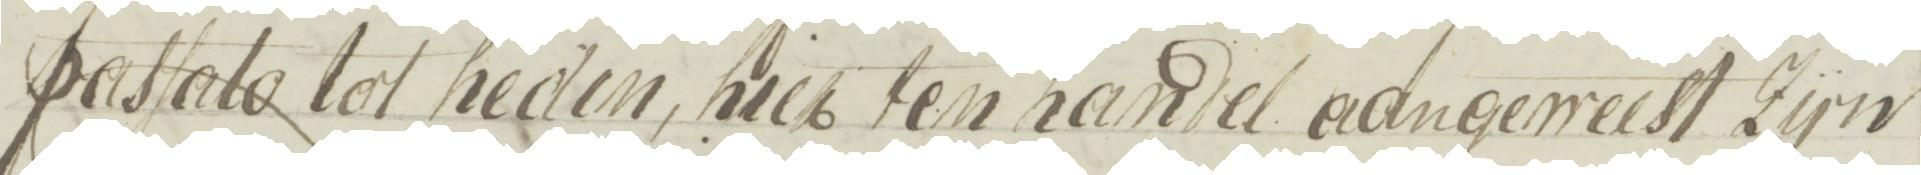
passato tot heden, hier ten handel aangeweest zijn
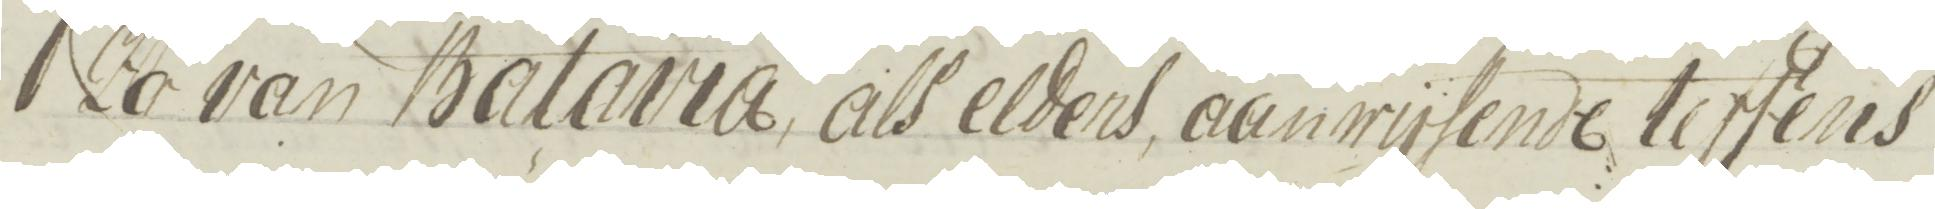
zo van Batavia, als elders, aanwijsende teffens
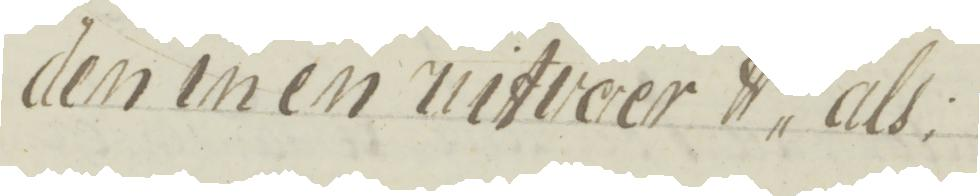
den in en uitvoer &„a als;
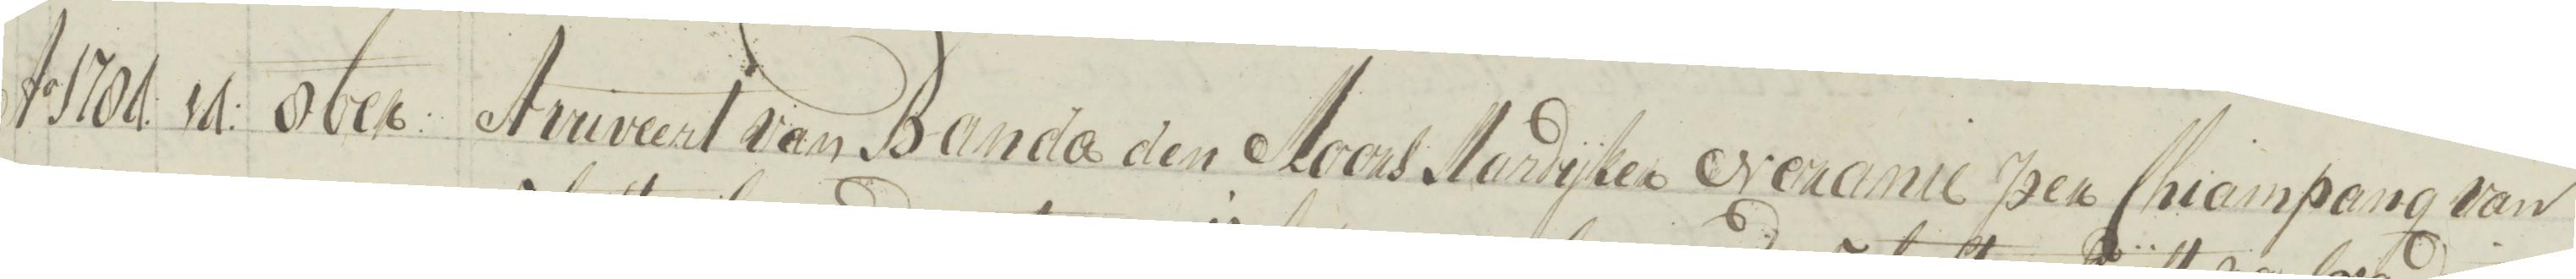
Ao 1784: 14: 8ber: Arriveert van Banda den Moors Mardijker Neranie per Chiampang van
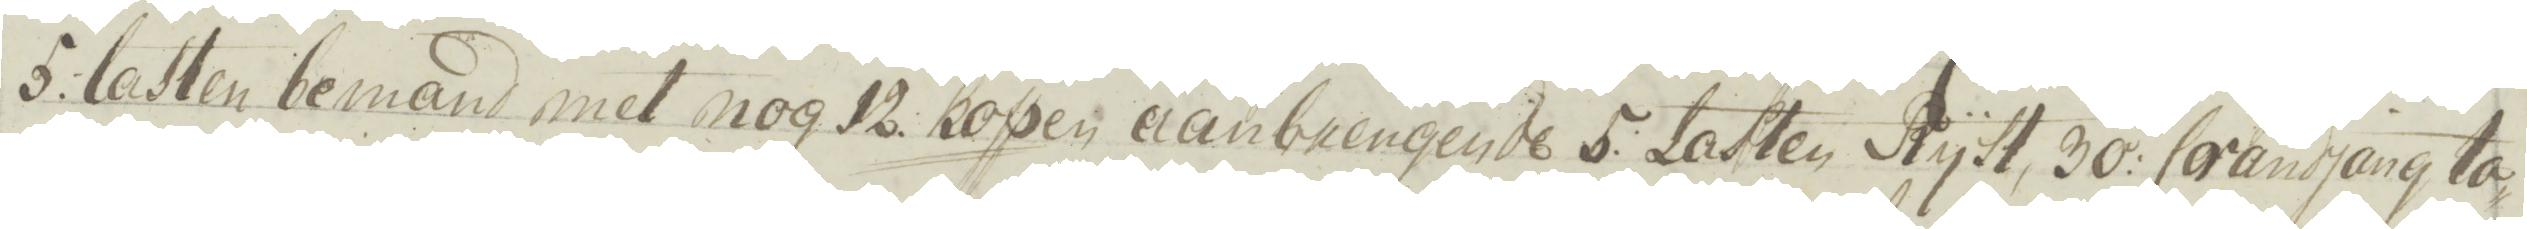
5: lasten bemand met nog 12. koppen aanbrengende 5: Lasten Rijst, 30: Corandjang to„
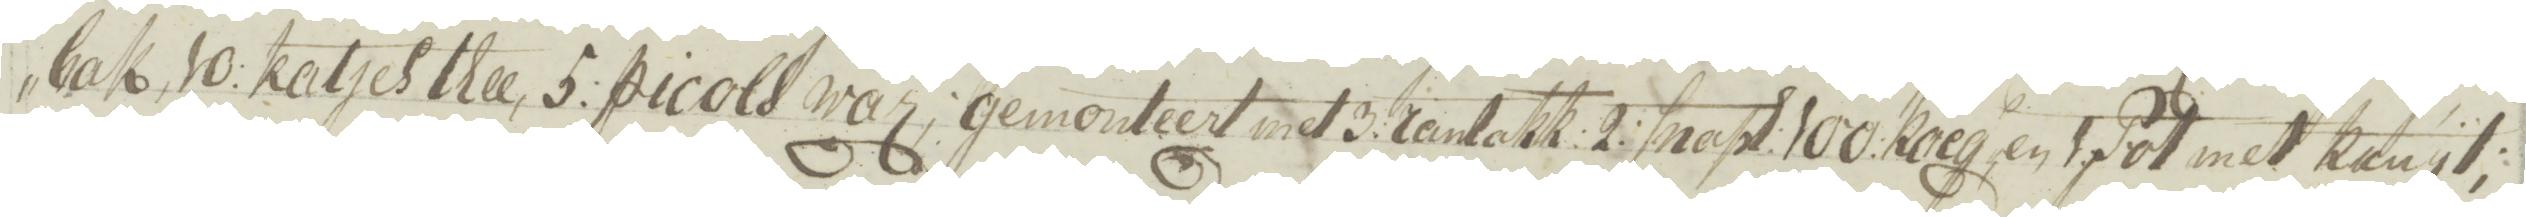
„bak, 10. katjes thee, 5: picols wax; gemonteert met 3: rantakk: 2: snaph: 100: koeg, en 1 Pot met kruijt,
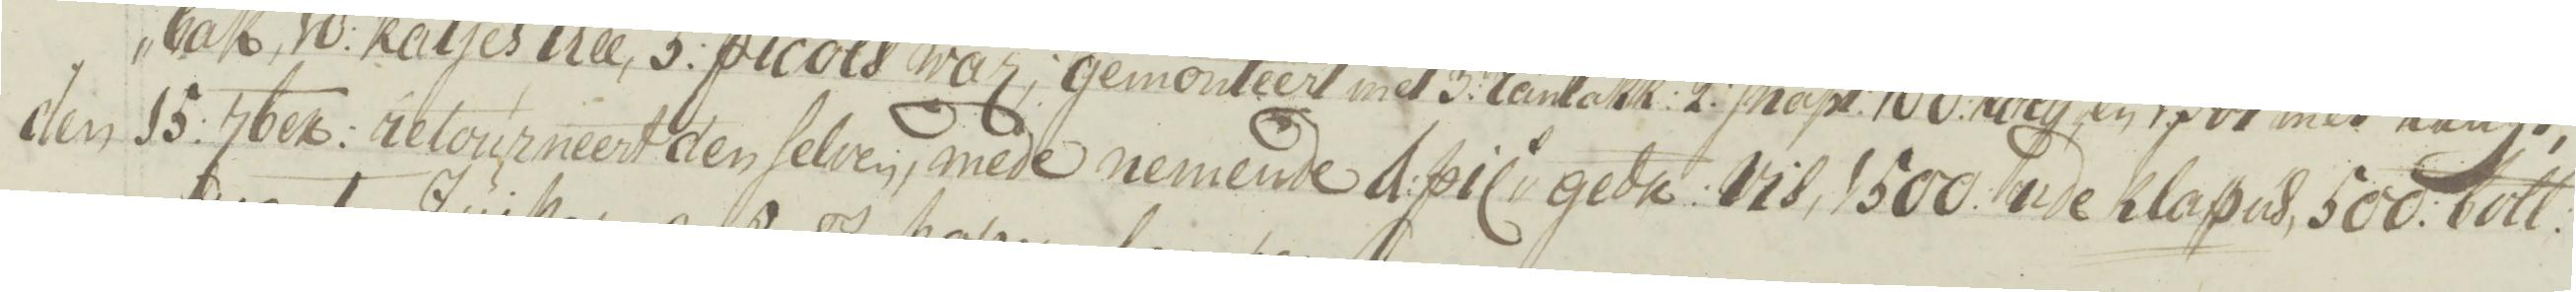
den 15: 7ber: retourneert den selven, mede nemende 4: pic„s gedr: vis, 1500: ende klappus, 500: bott:
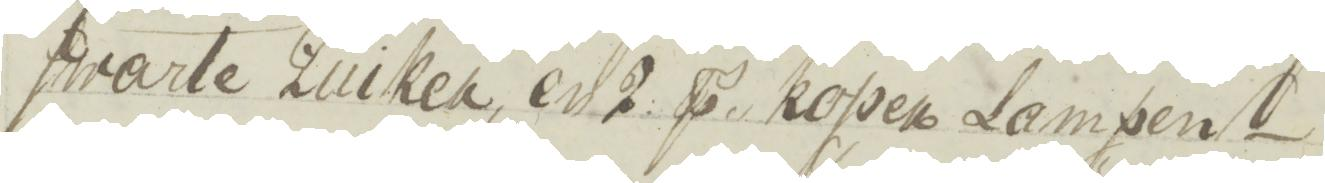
swarte Zuiker, en 2: p„s koper Lampen —
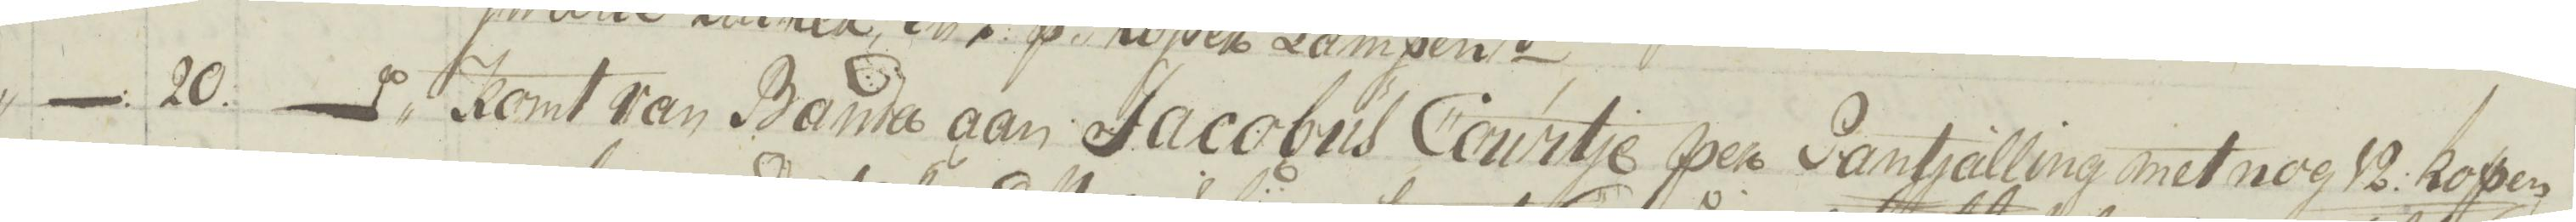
„ —: 20: _„o komt van Banda aan Jacobus Courtje per Pantjalling met nog 12: koppen
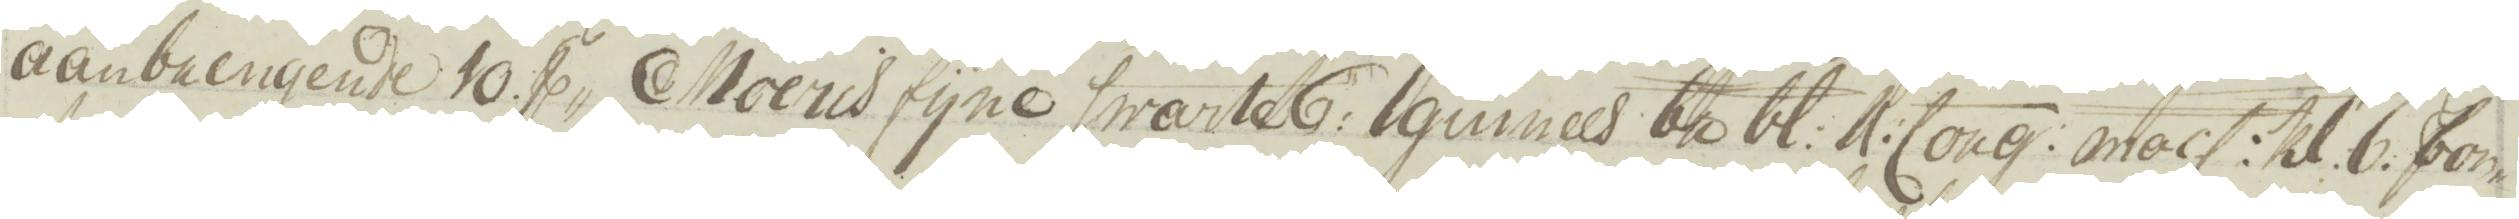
aanbrengende 10. p„s Moeris fijne swarte 6: guinees 60 bl: 4: Cong: mocs: kl: 6. pon
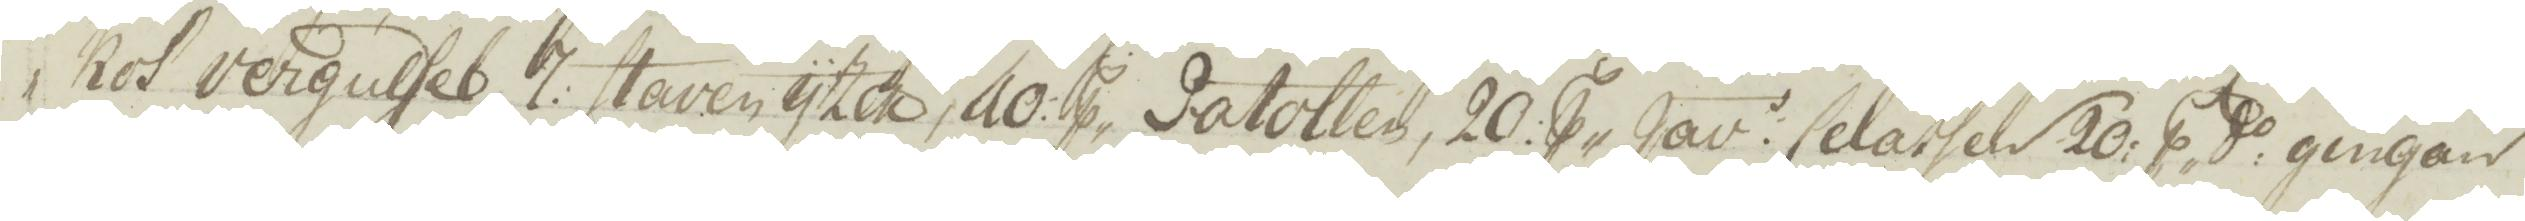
kos vergulsel 7: staven ijzer, 40: p„s Patollen, 20: p„s Jav:s Celassen 20: p„s d:o gingan
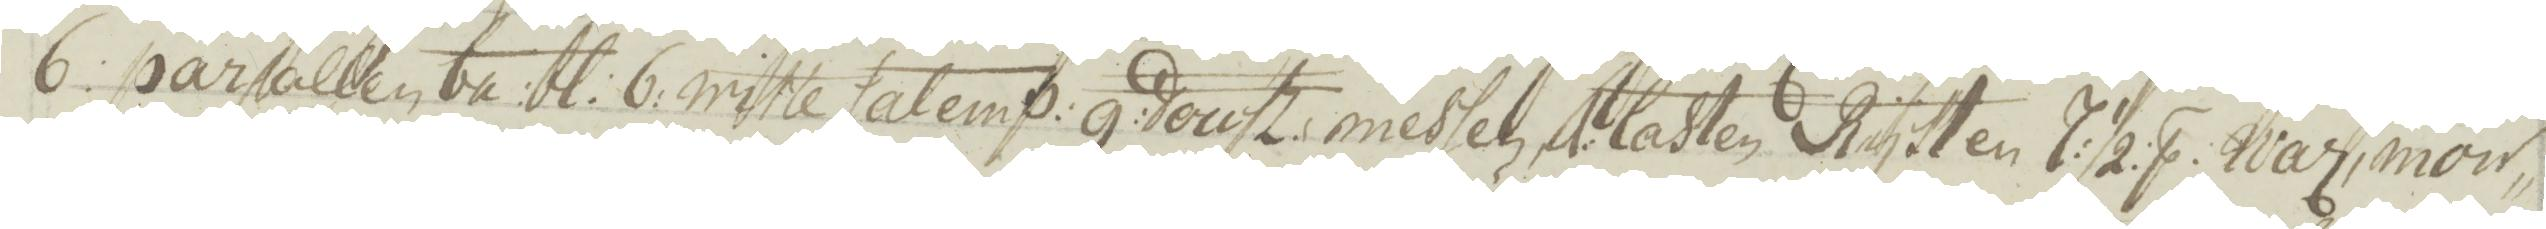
6: parcallen br: bl: 6: witte salemp: 9: dousz, messen, 4: lasten Rijst en 7:½:p: Wax, mon„
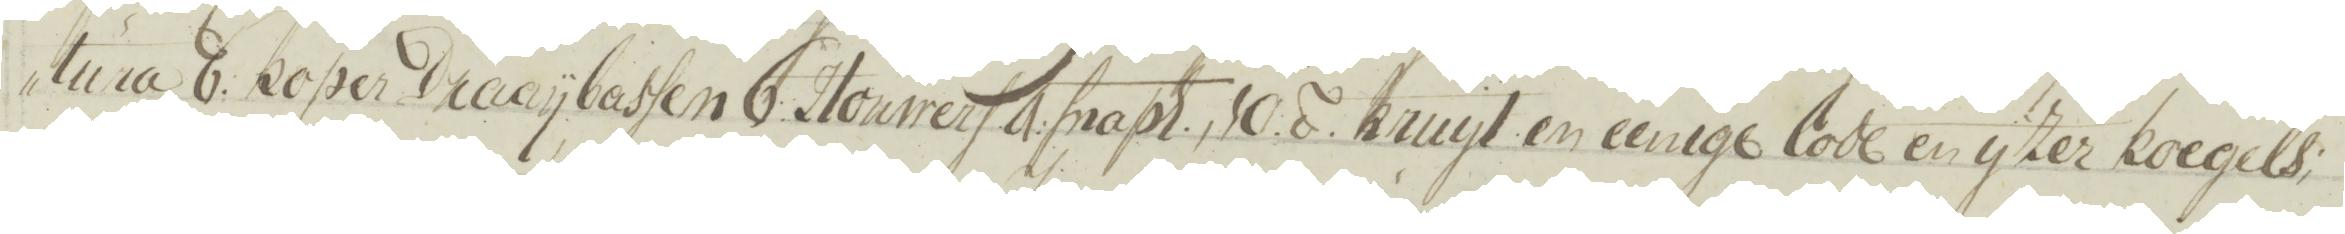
„tura 6: koper Draaijbassen 6: Houwers 4: snaph:, 10: lb. kruijt en eenige lode en ijzer koegels;
